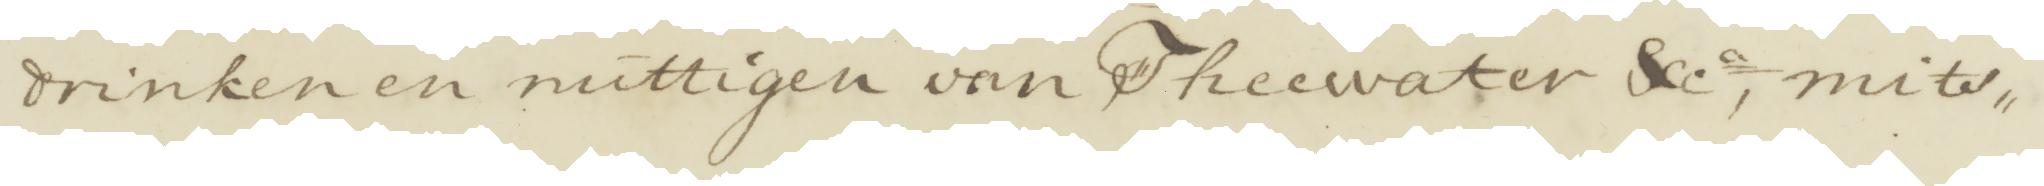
drinken en nuttigen van Theewater &c=a, mits„
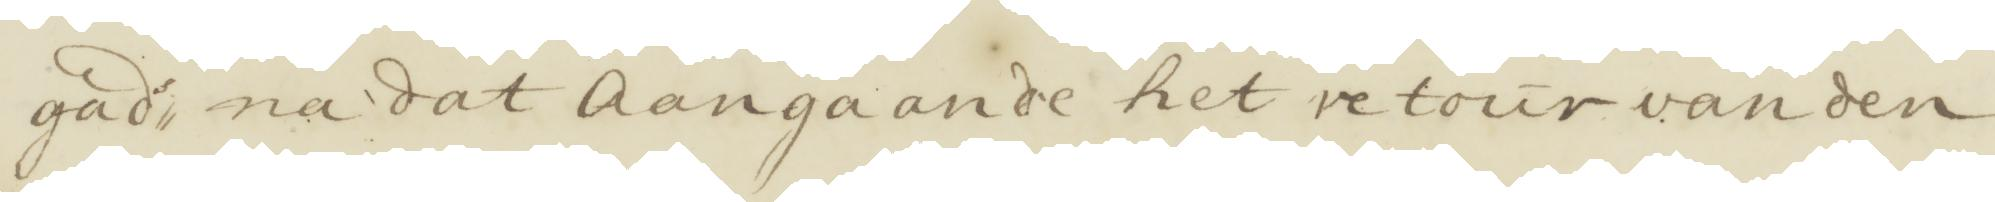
gad„s na dat aangaande het retour van den
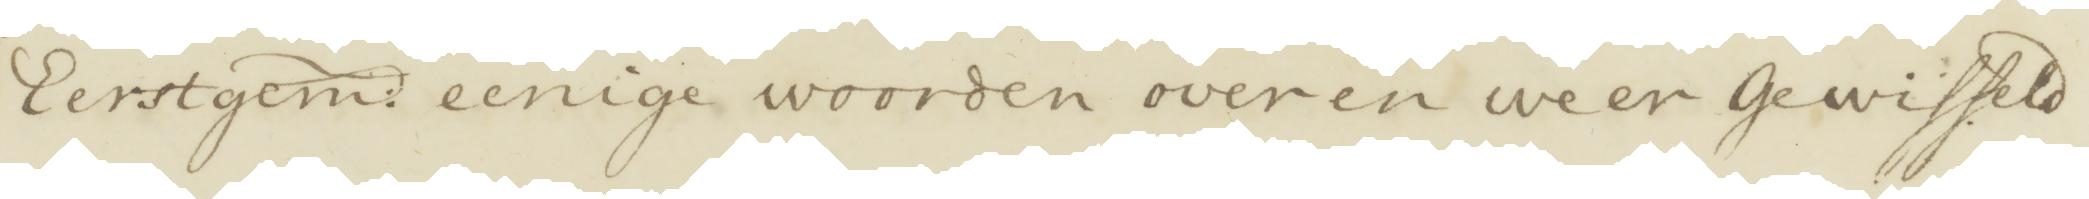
Eerstgem: eenige woorden over en weer gewisseld
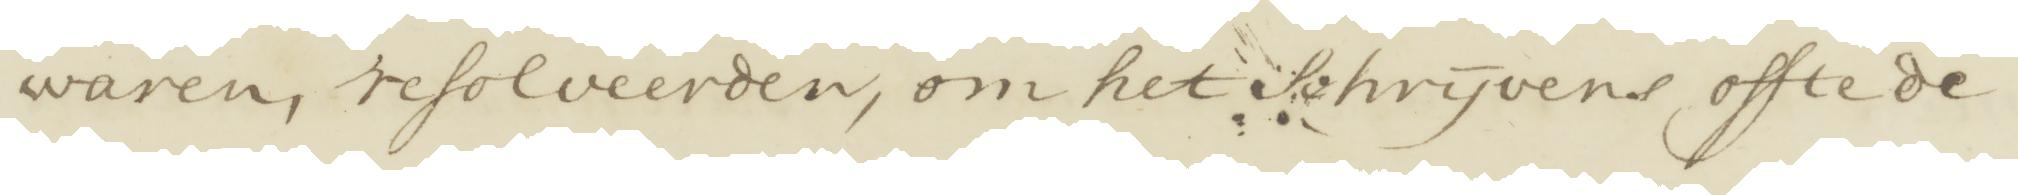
waren, resolveerden, om het schrijvens offte de
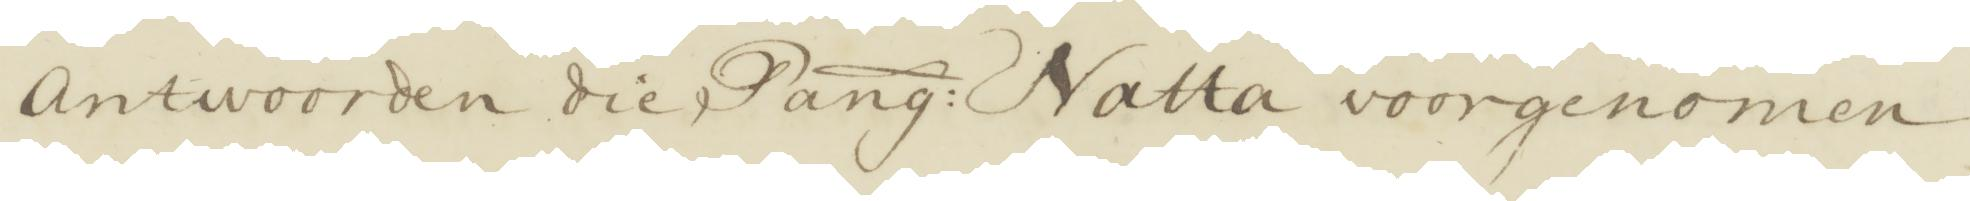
antwoorden die Pang: Natta voorgenomen
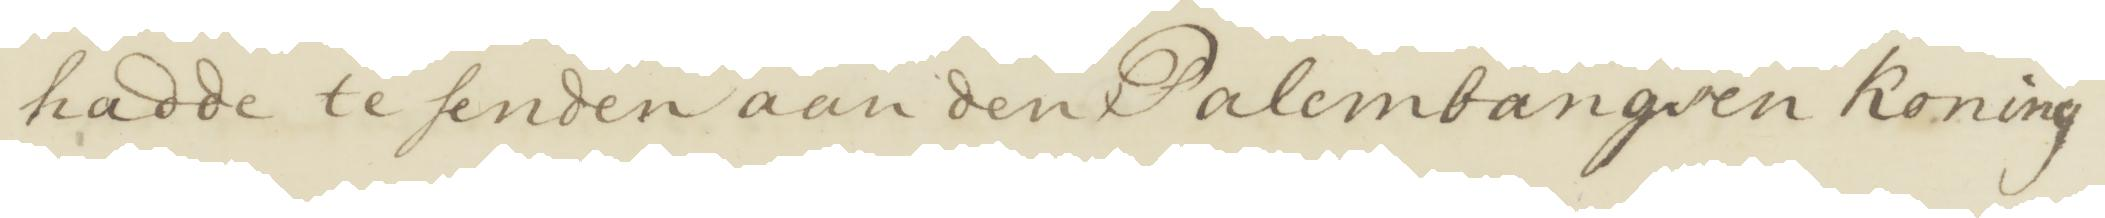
hadde te senden aan den Palembangsen Koning
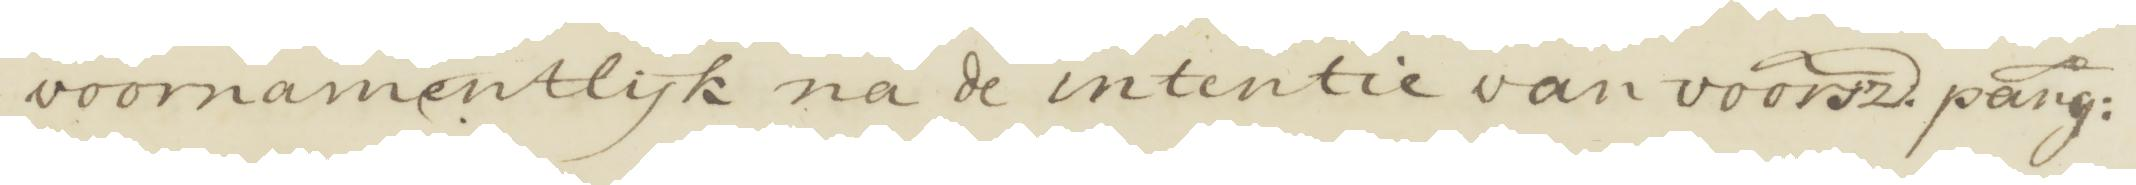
voornamentlijk na de intentie van voorsz: pang:
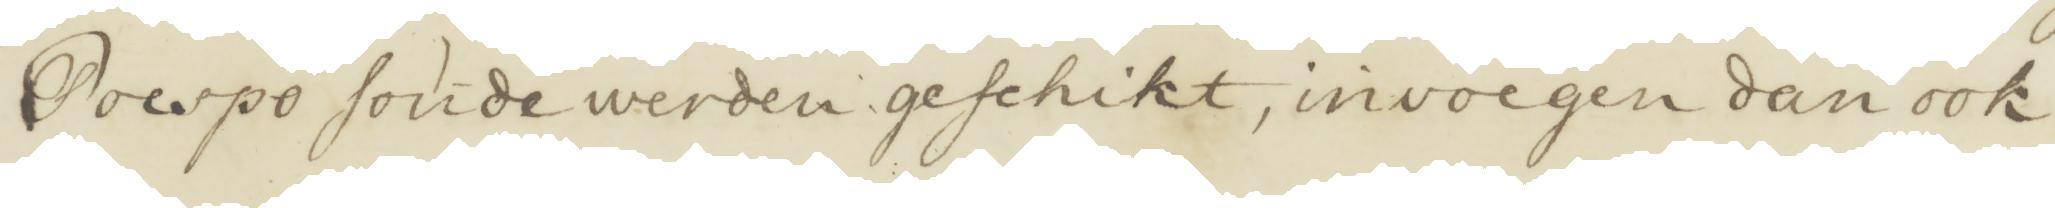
Poespo soude werden geschikt, invoegen dan ook
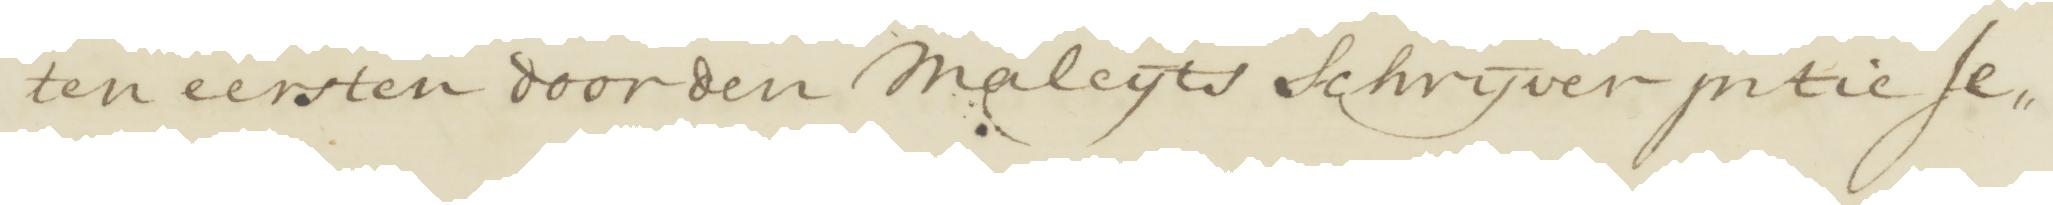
ten eersten door den maleijts schrijver jntie Je„
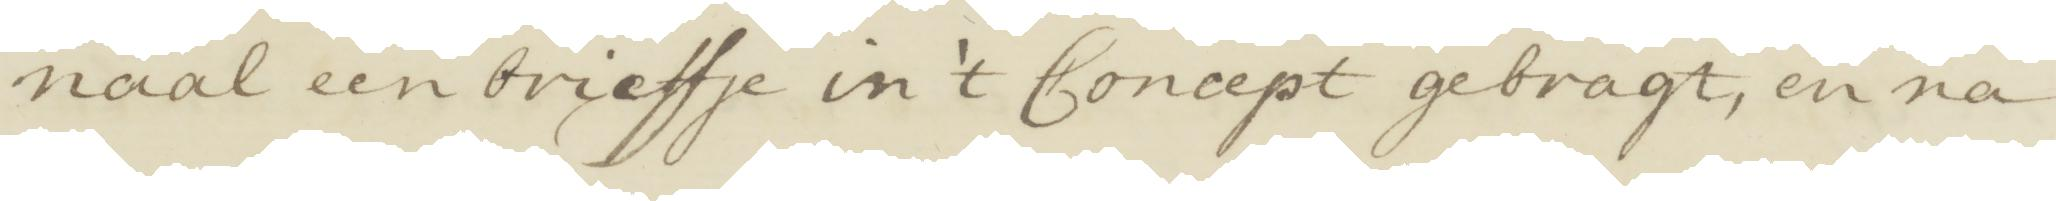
naal een brieffje in ’t concept gebragt, en na
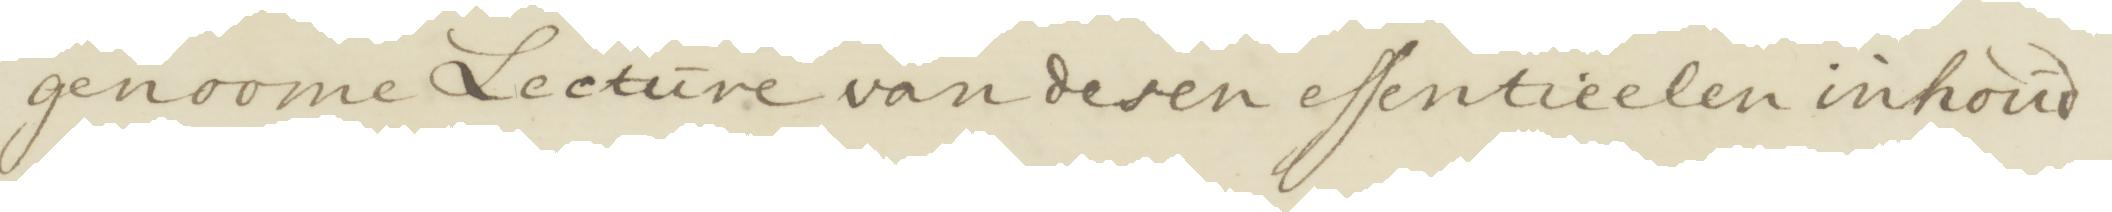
genoome Lecture van desen essentieelen inhoud
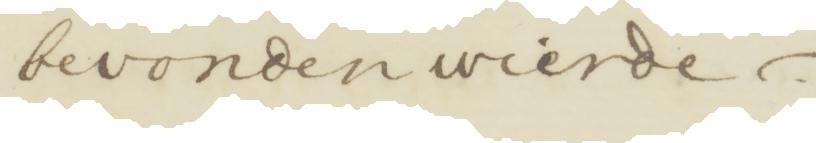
bevonden wierde.
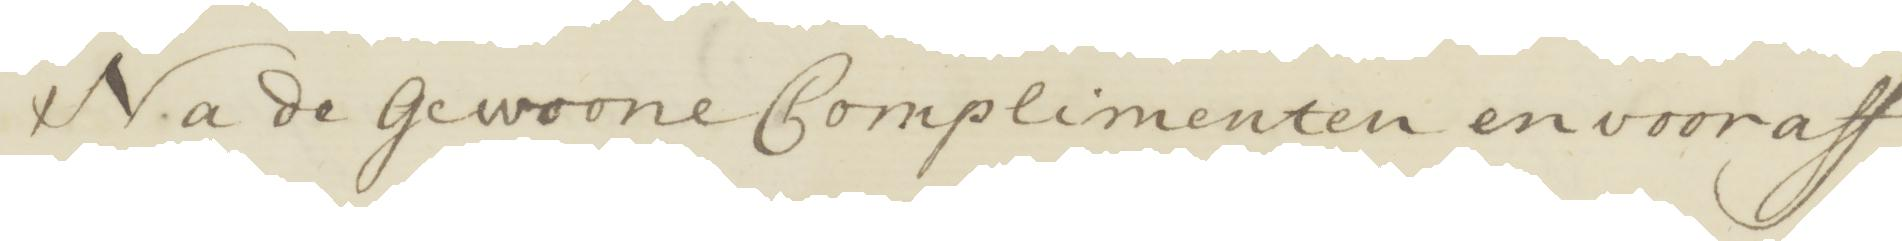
Na de gewoone complimenten en voor aff
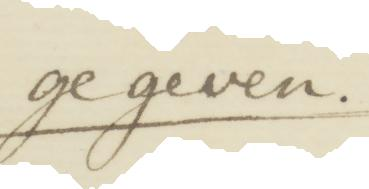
gegeven.
